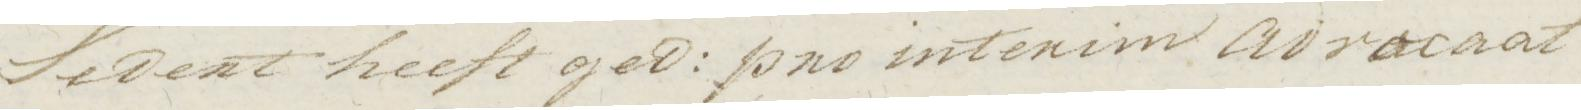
Sedert heeft ged: pro interim advocaat
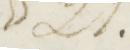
§21
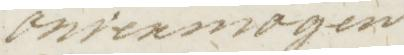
onvermogen
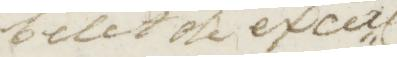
belet de exce„
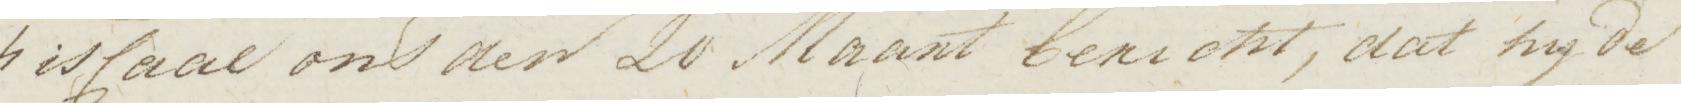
Fiscaal ons den 20 Maart bericht, dat hy de
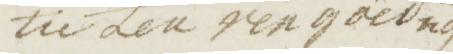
tie ten vergoeding
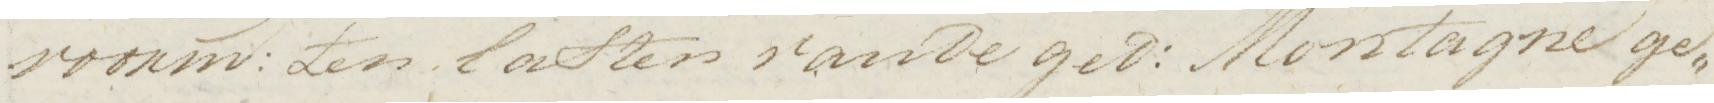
voorm: ten laster van de ged: Montagne ge„
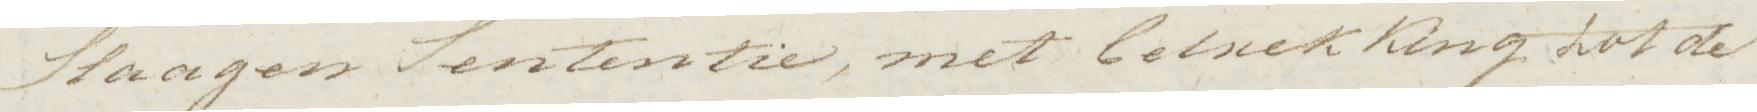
slaagen sententie, met betrekking tot de
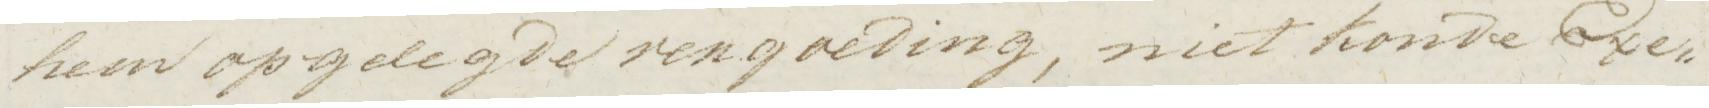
hem opgelegde vergoeding, niet konde Exe„
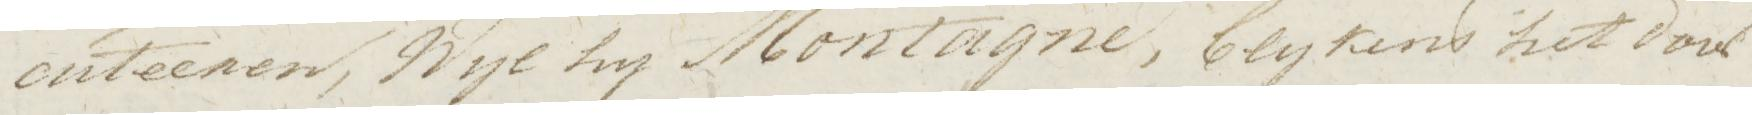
cuteeren, wyl hy Montagne, blykens het door
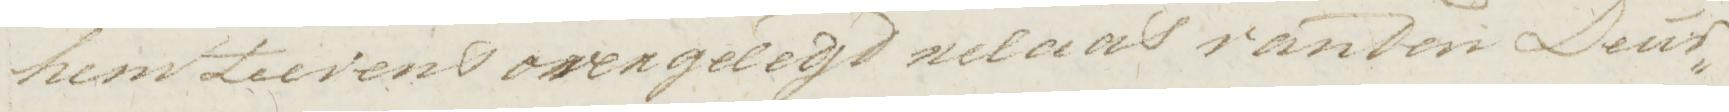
hem zelven overlegd relaas van den Deur„
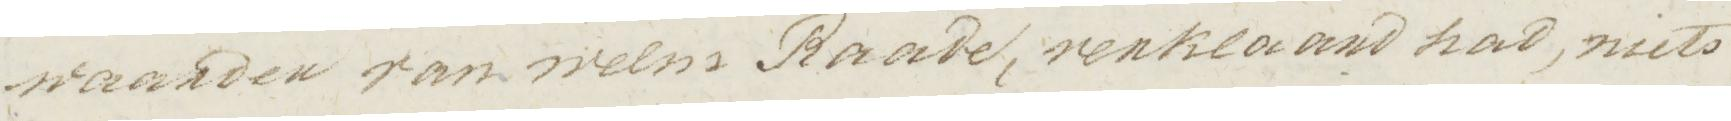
waarder van welks Raade, verklaard had, niets
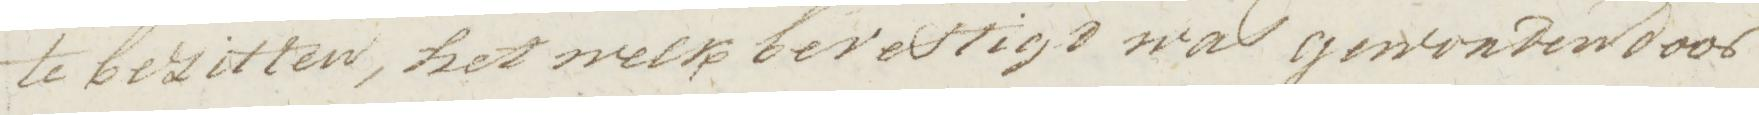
te bezitten, het welk bevestigd was geworden door
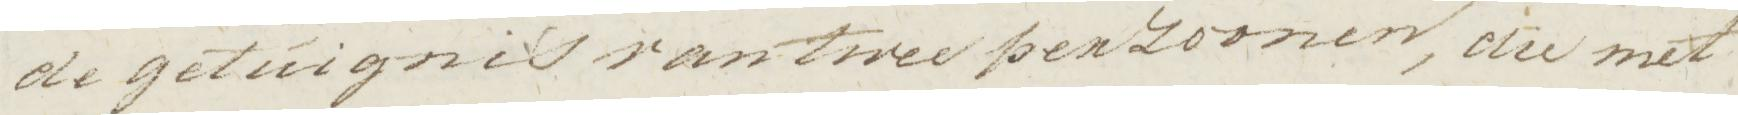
de getuignis van twee perzoonen, die met
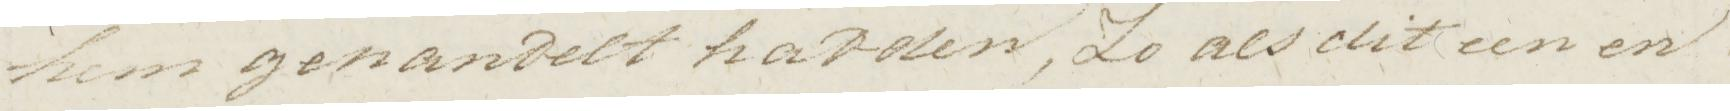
hem gehandelt hadden, zo als dit een en
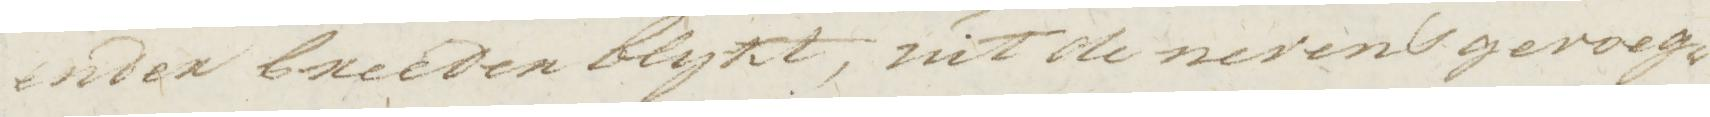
ander breeder blijkt, uit de nevengevoeg
